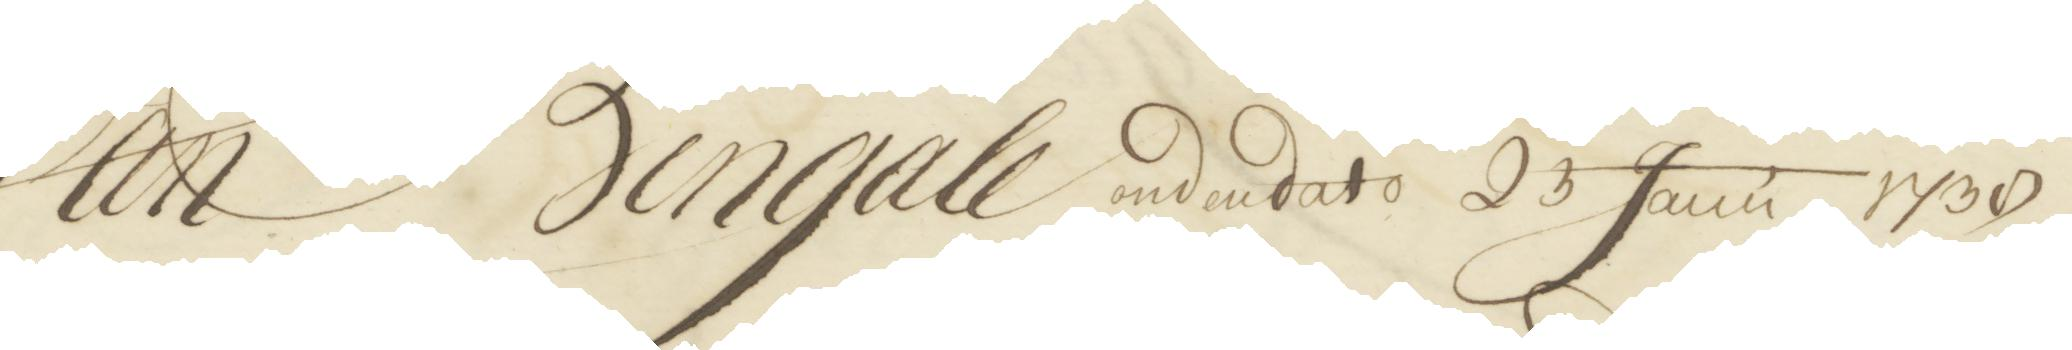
Van Bengale onder dato 23 Janu 1738
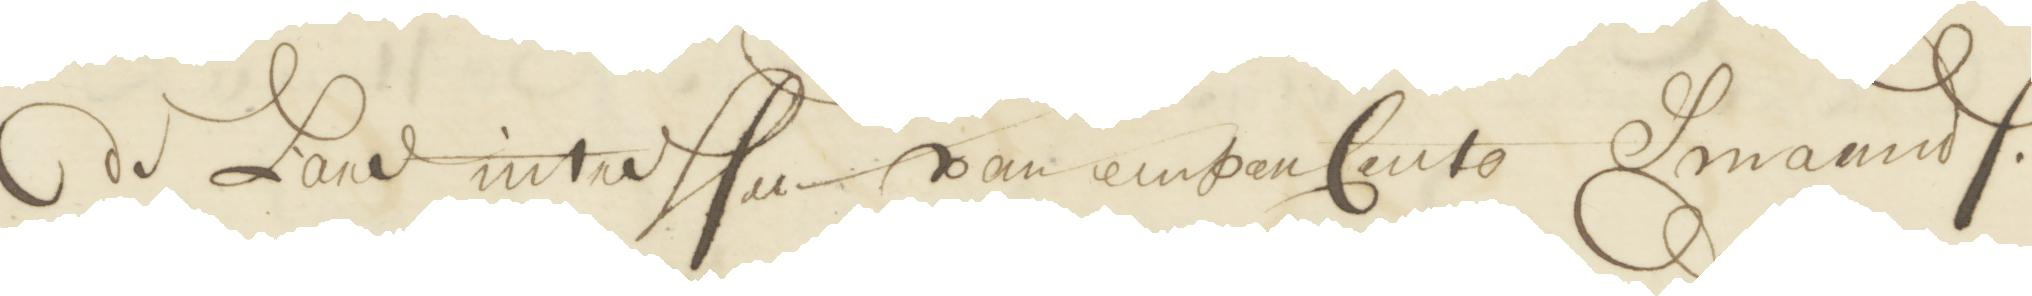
de hare intressen van een per Cento Smaans
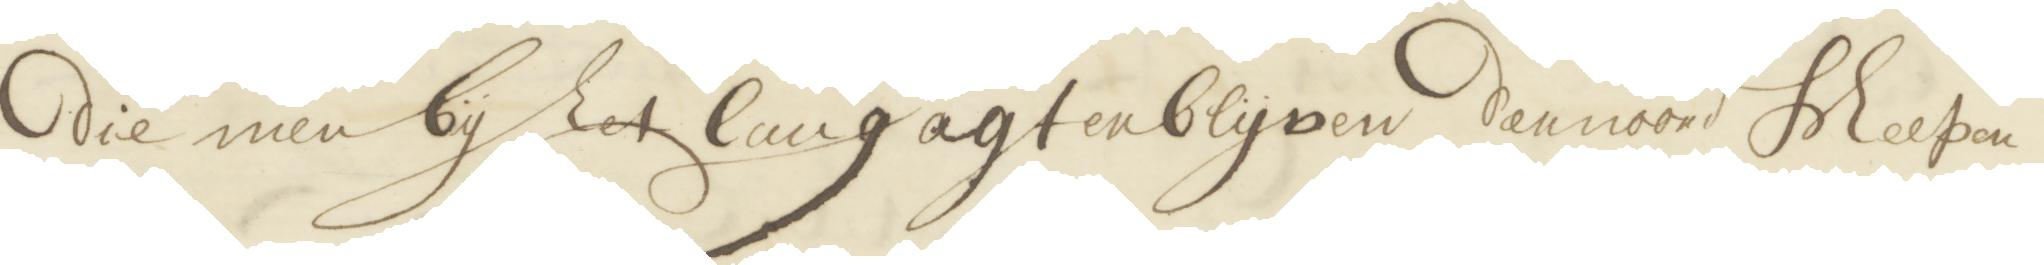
die men bij het lang agterblijven der noord scheepen
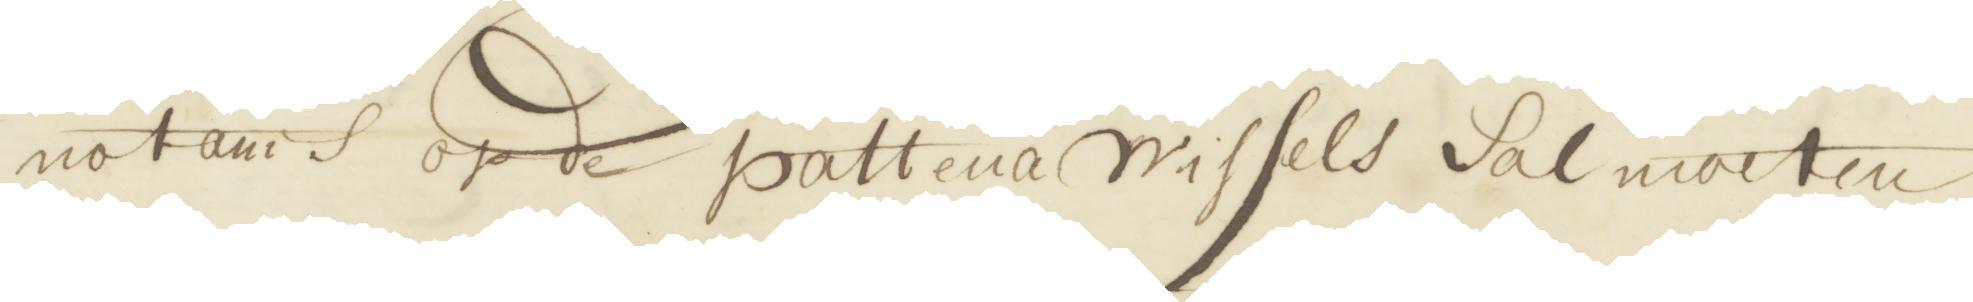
notaris op de pattena wissels sal moeten
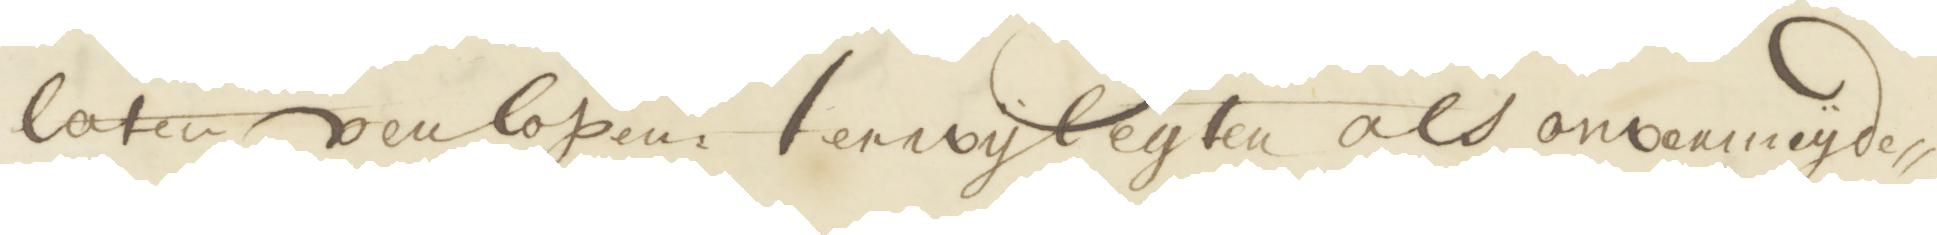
laten verlopen terwijl egter als onvermeijde„
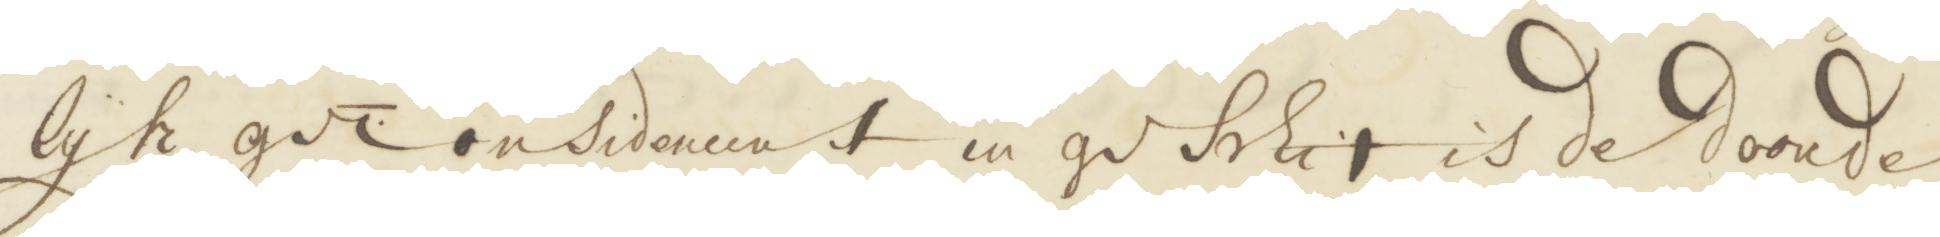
lijk geconsidereert en geschit is de door de
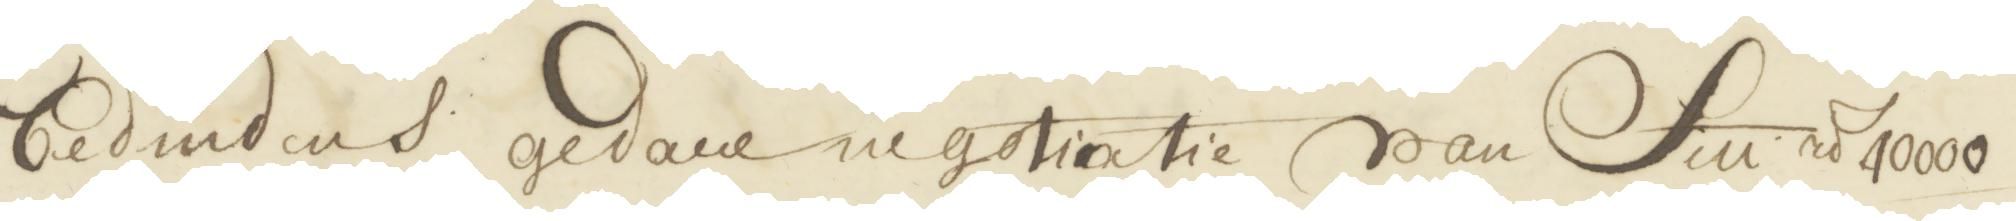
bedindens gedane negotiatie van Sin rds 40000
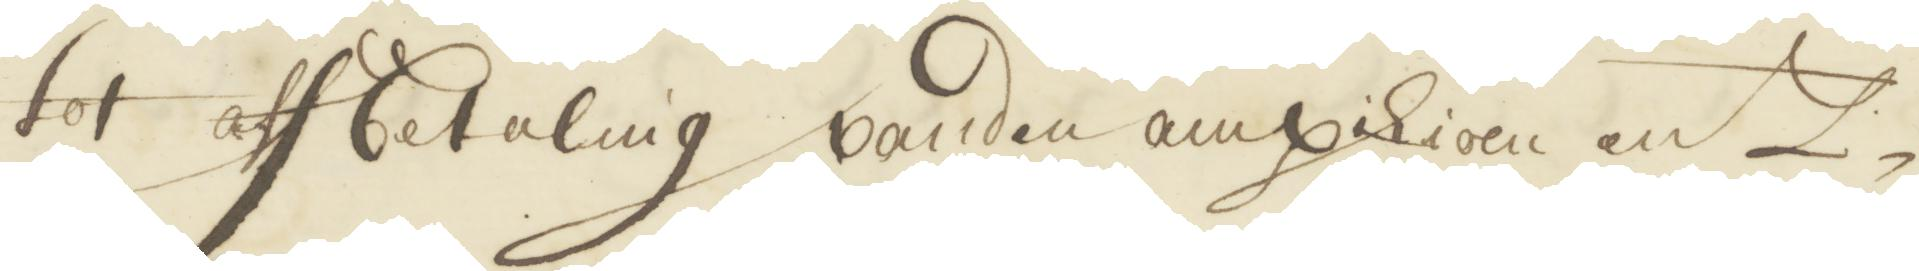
tot affbetaling vanden ampihioen enz –
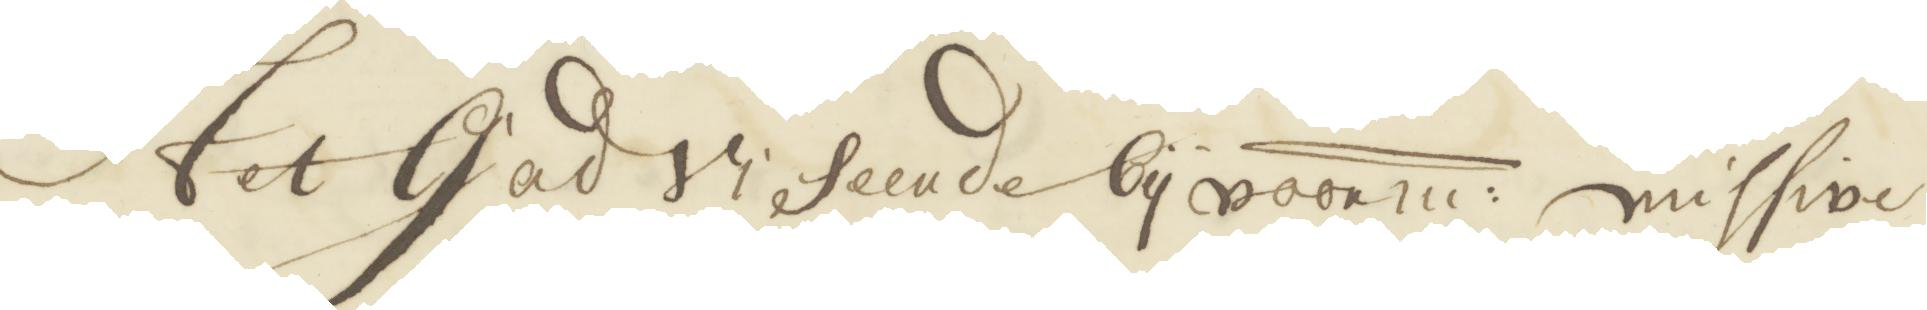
het g'adviseerde bij voorm: missive
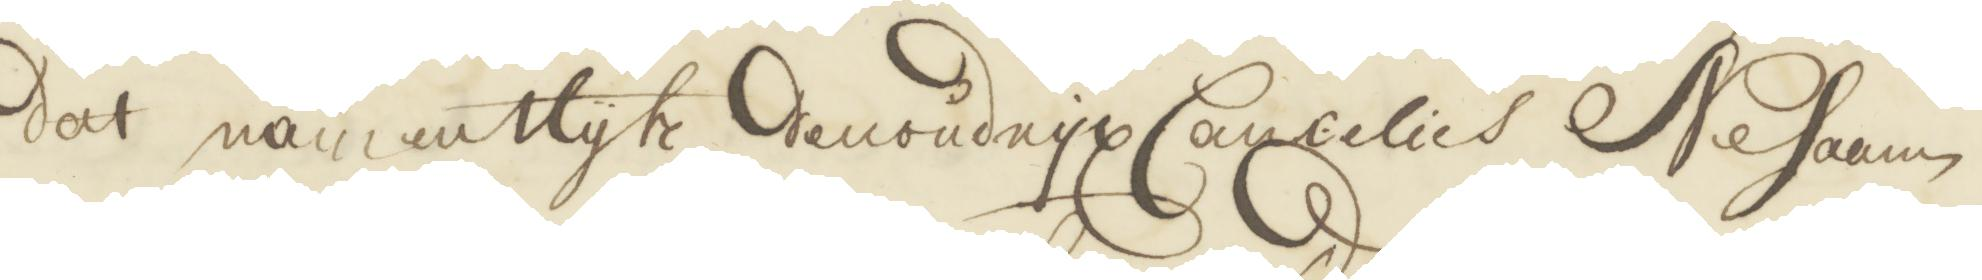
dat namentlijk denoudrijx Cancelies Nesaam
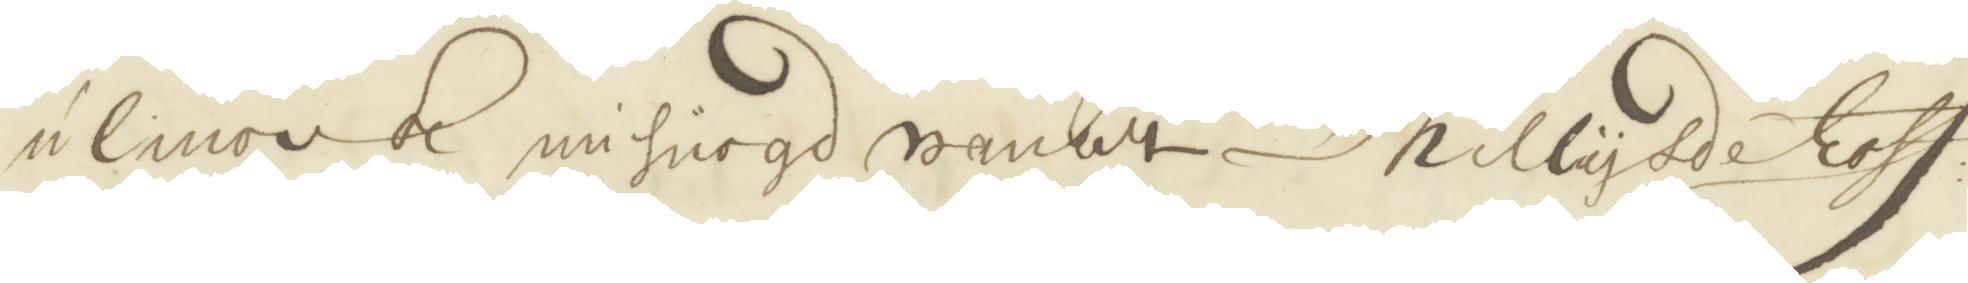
ulmoek misnögd van het Dhillijsde hoff
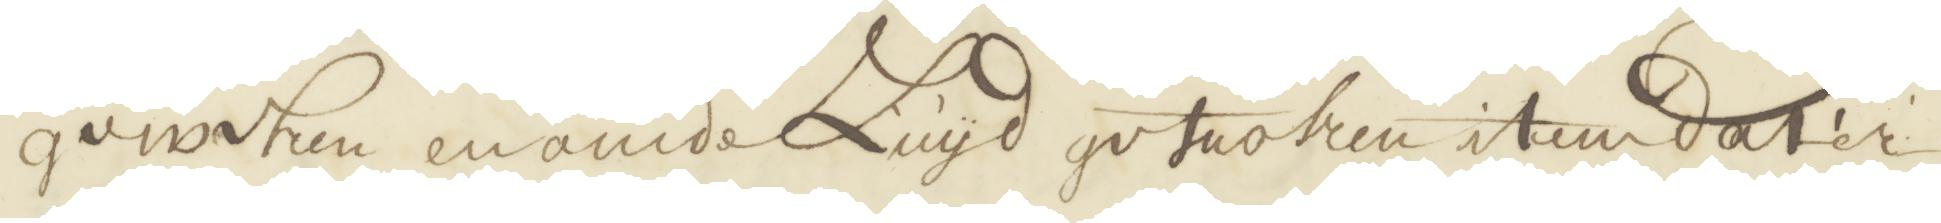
geweken en omde zuijd getroken item dat 'er
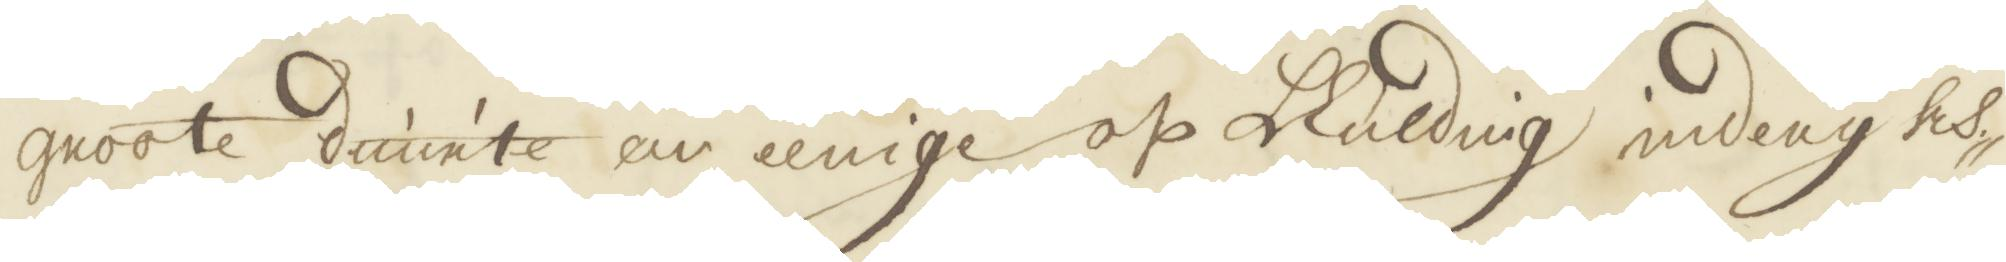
groote duurte en eenige op schulding inde rijks.„
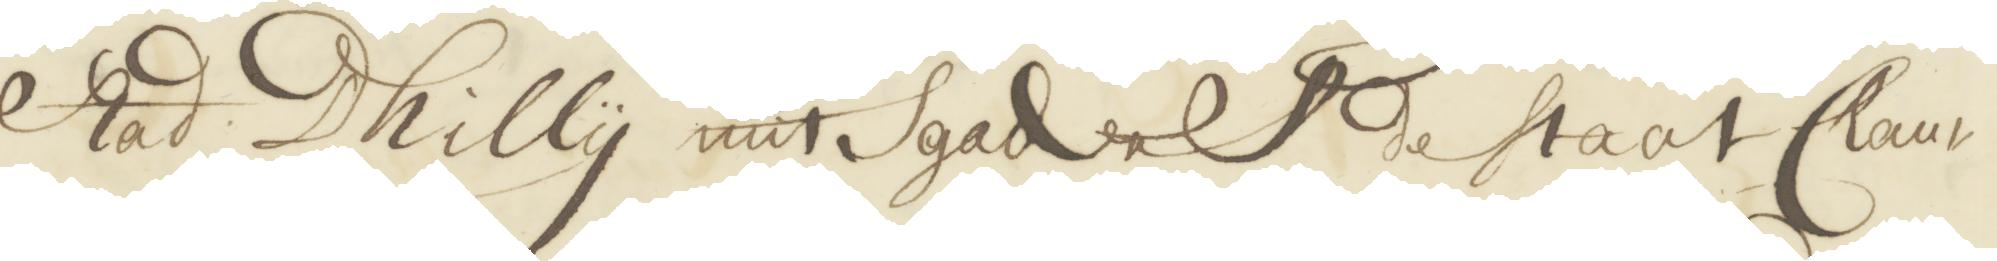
stad Dhillij mit sgaders de staat Cham
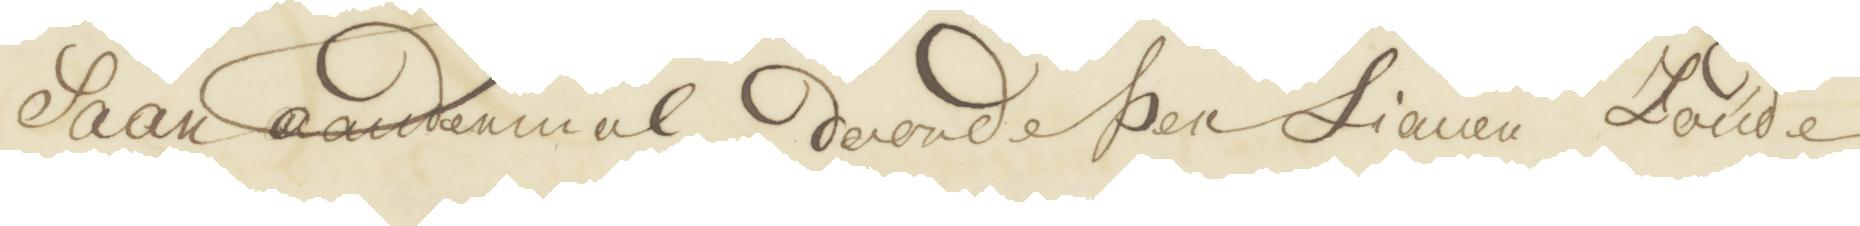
Saar aandermal door de per Lianer zoude
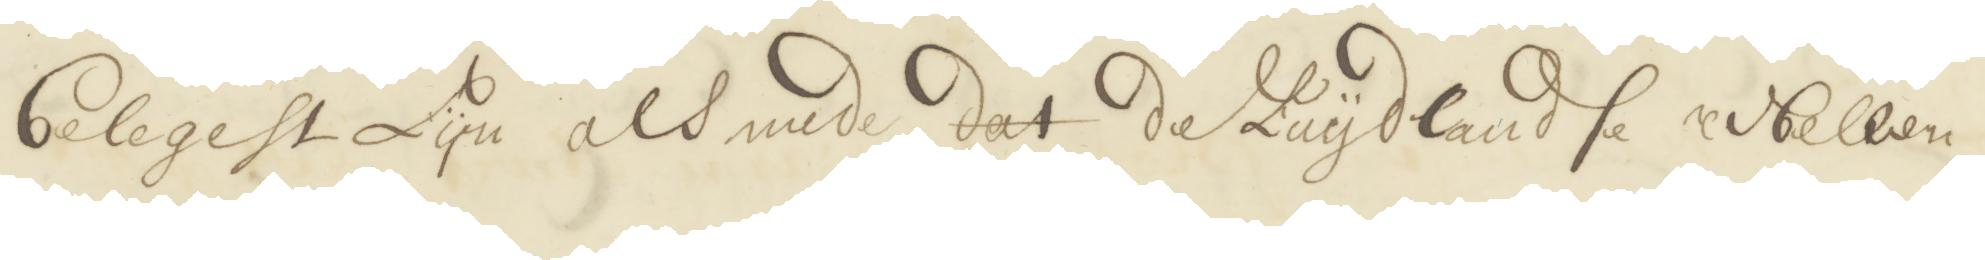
belegest zijn als mede dat de zuijdlandse rebellen
